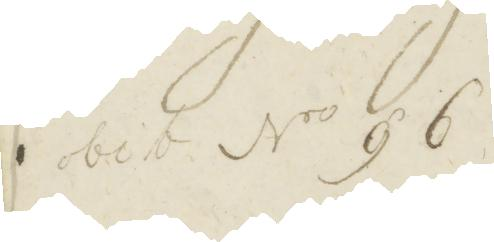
obit No 96
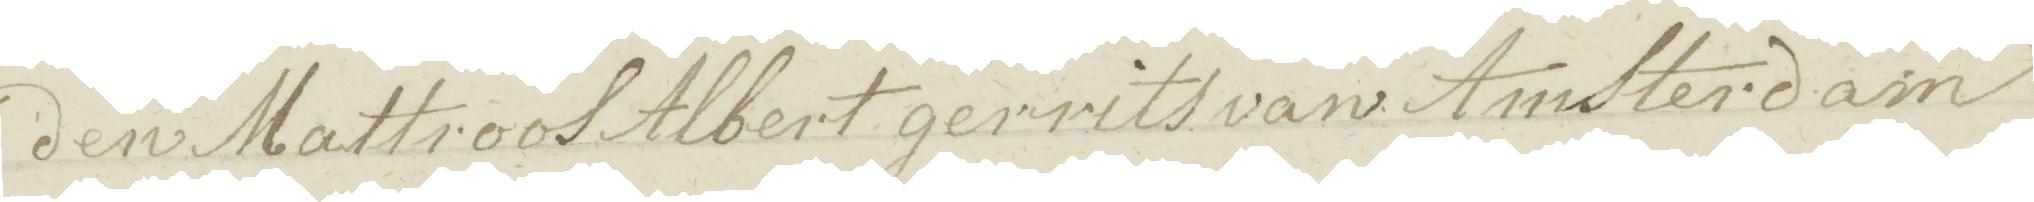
den Mattroos Albert gerrits van Amsterdam
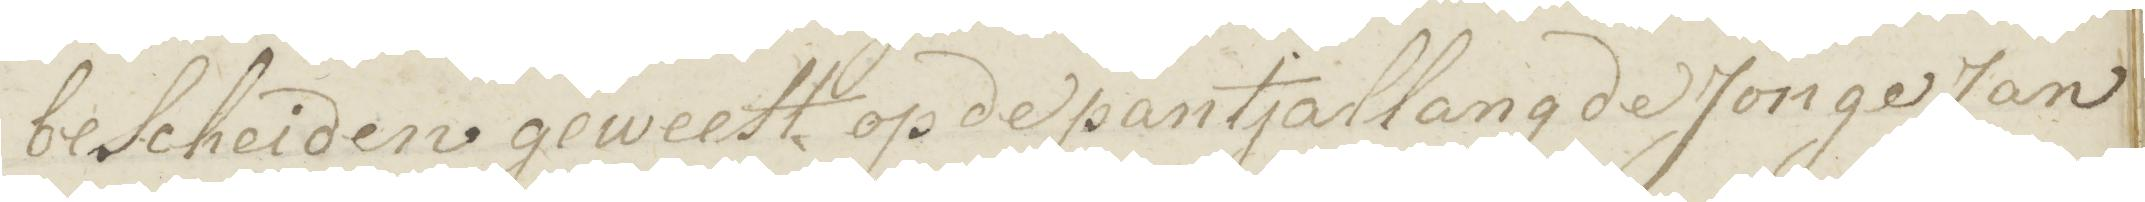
bescheiden geweest op de pantjallang de Jonge Jan
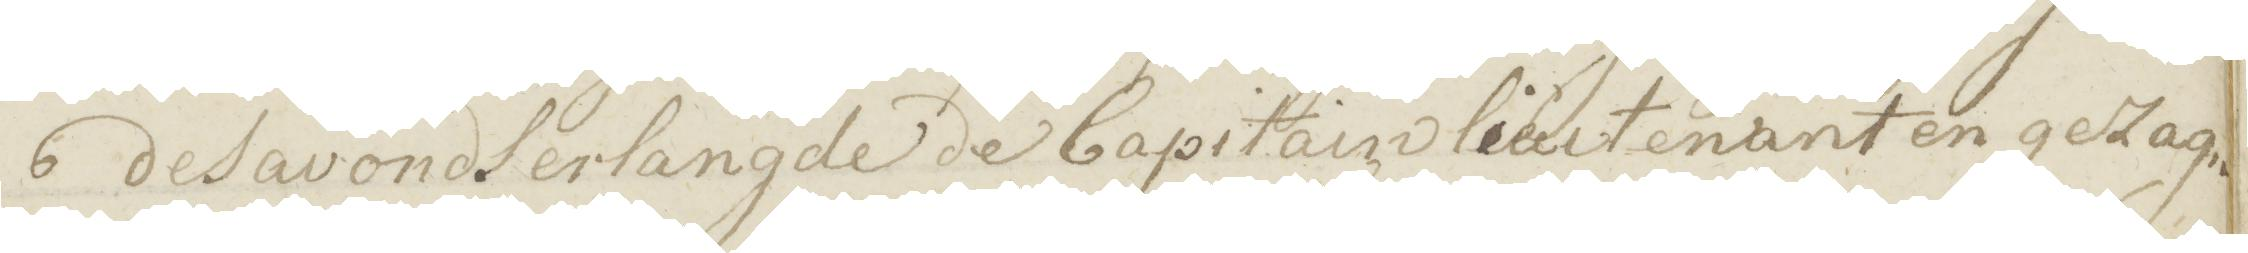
des avonds erlangde de Capitain lieutenant en gezag„
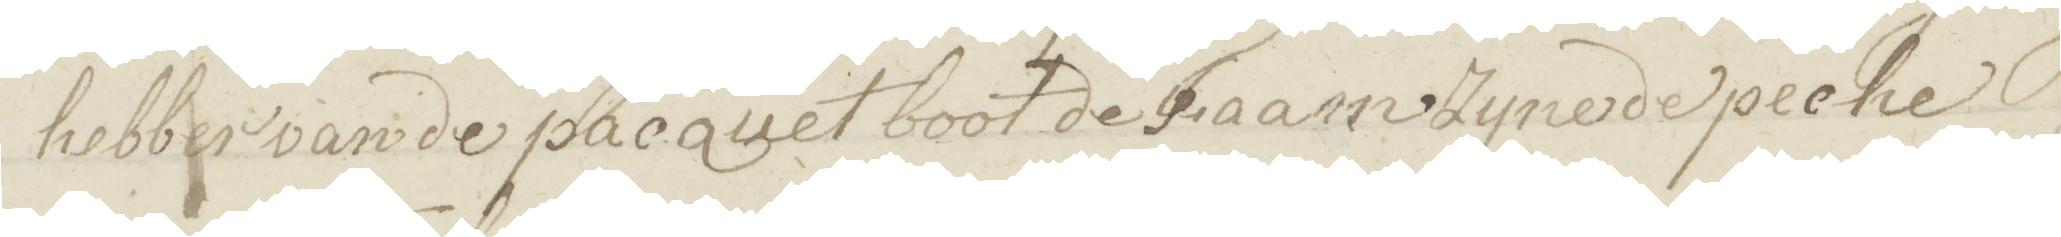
hebber van de pacquet boot de Faam zyne depeche
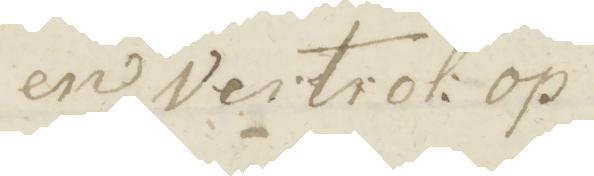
en vertrok op
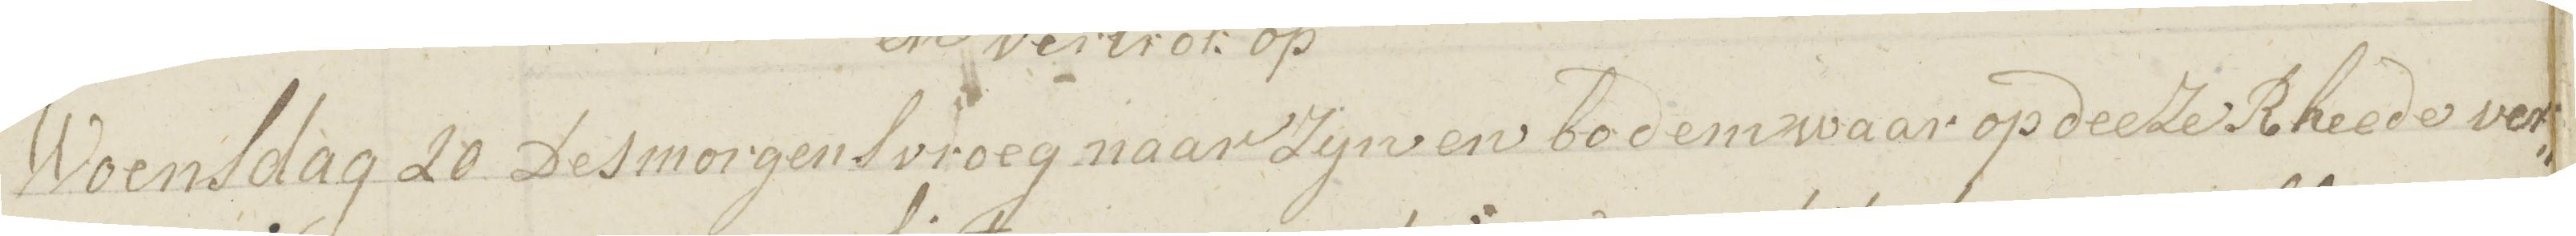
Woensdag 20. Des morgens vroeg naar zyn en bodem waar op deeze Rheede ver„
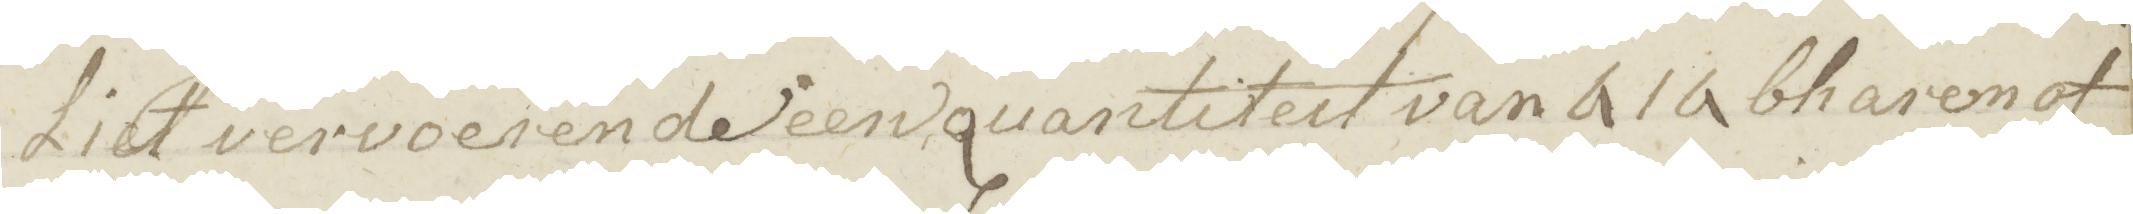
liet vervoerende een quantiteit van 414 bharen of
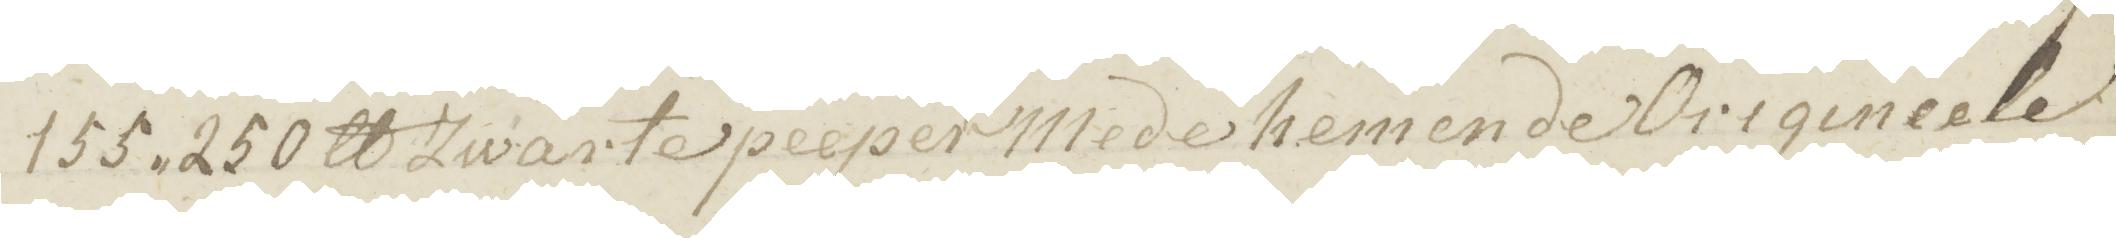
155„250 lb zwarte peeper mede nemende Origineele
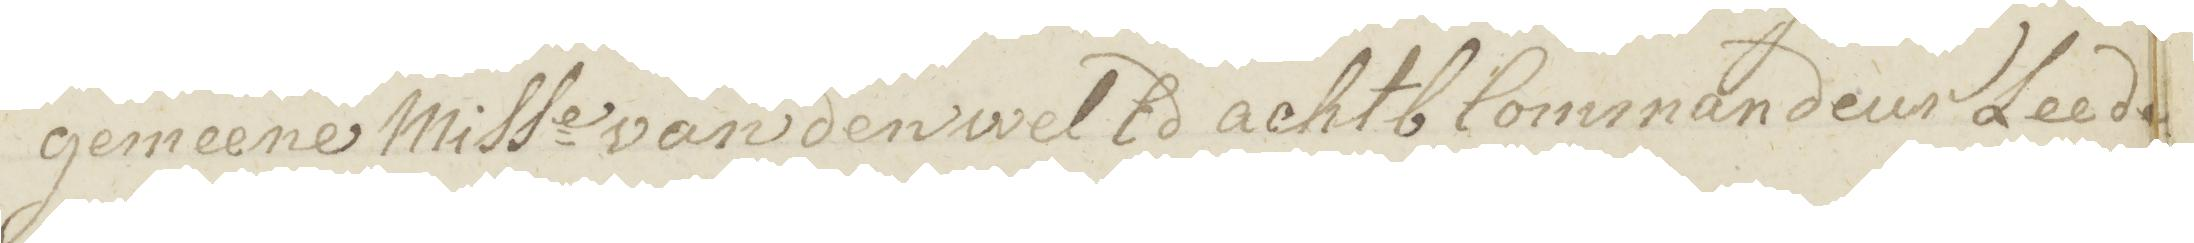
gemeene miss=e van den wel Ed achtb Commandeur leed
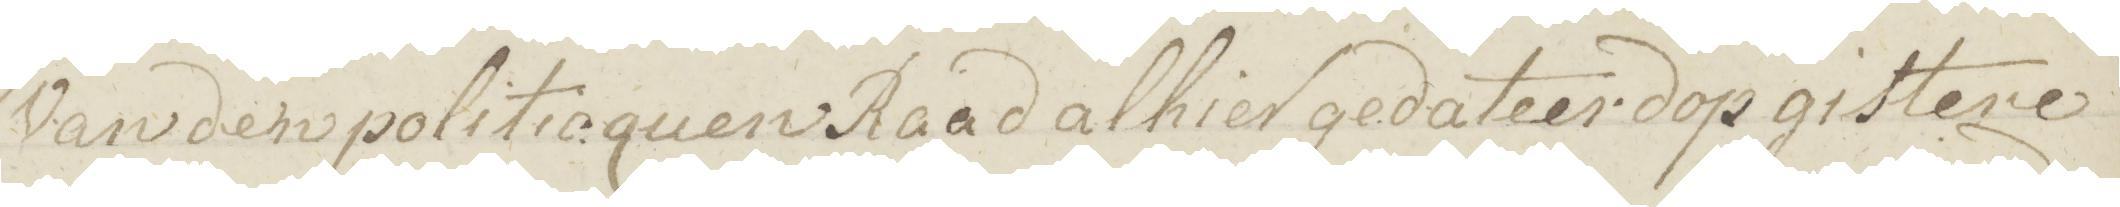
van den politicquen Raad alhier gedateerd op gistere
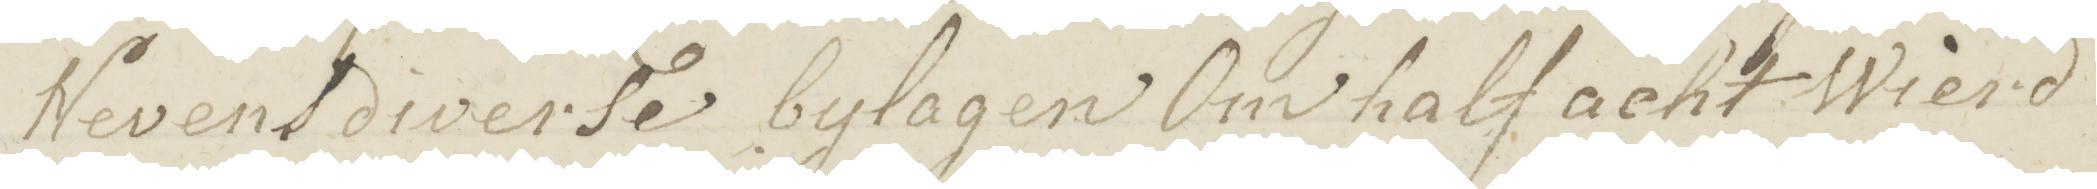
Nevens diverse bylagen Om half acht wierd
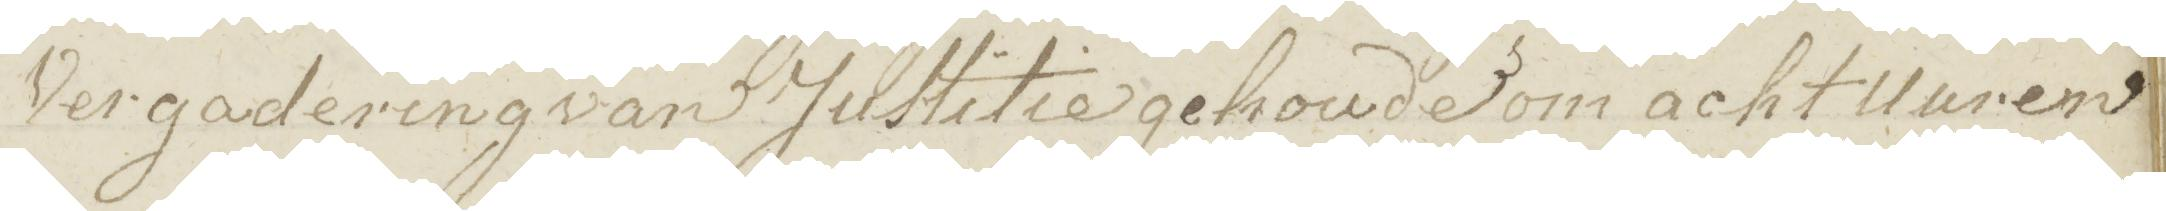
Vergadering van Justitie gehoude om acht uuren
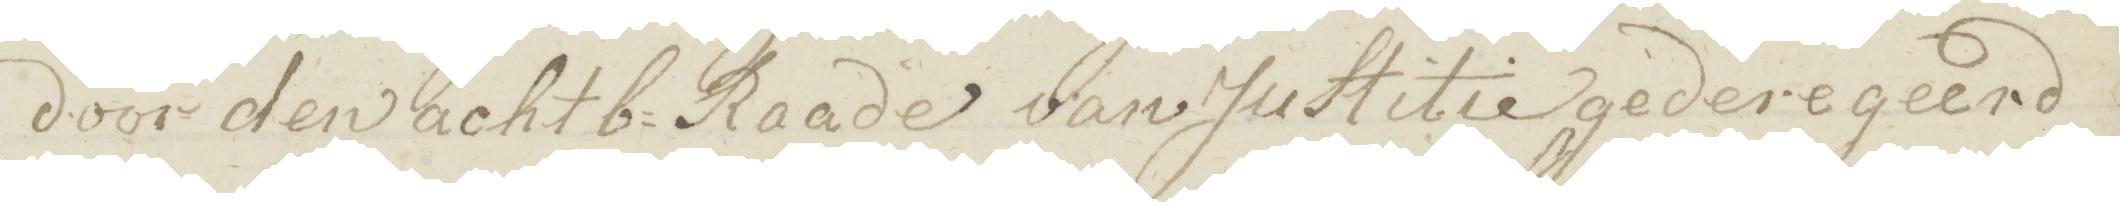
door den achtb: Raade van Justitie gederegeerd
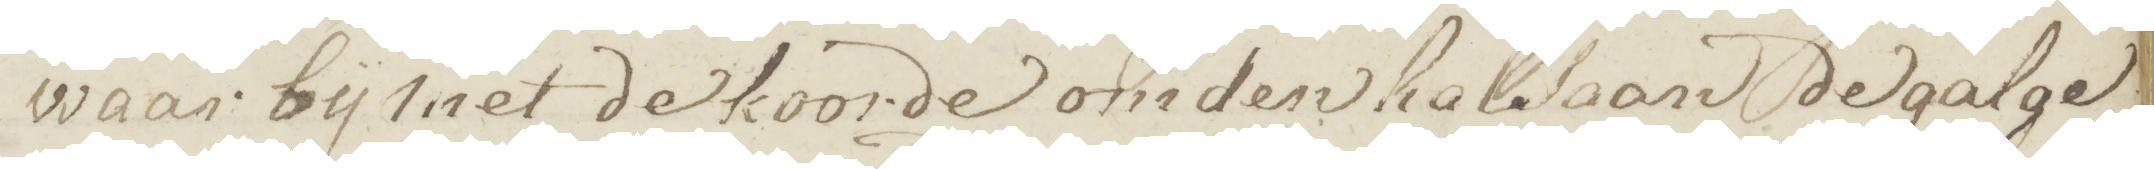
waar bij met de koorde om den hals aan de galge
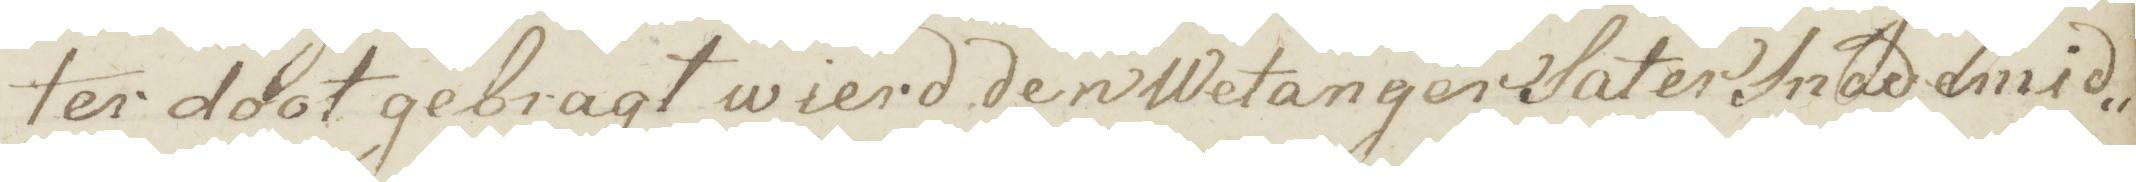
ter doot gebragt wierd den Wetanger saters nademid„
